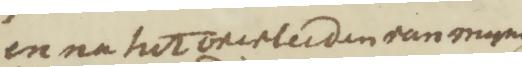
en na het overleiden van myn
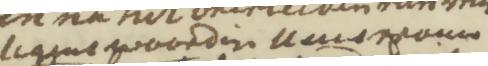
tegenswoordige Huisvrouw
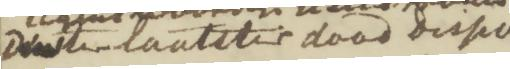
danter laatster dood dispo
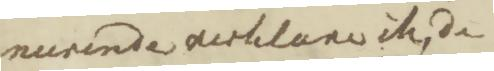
neerende verklare ik, de
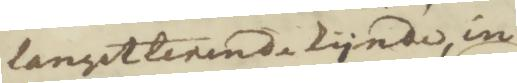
langstlevende zijnde, in
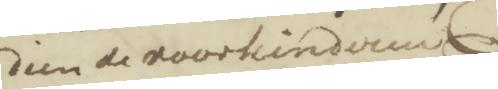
dien de voorkinderen
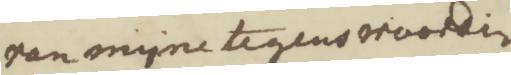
van mijne tegenswoordig
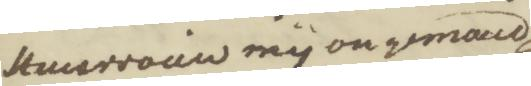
Huisvrouw mij ongemoeid
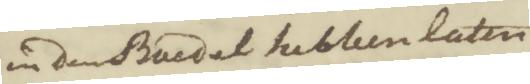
in den Boedel hebben laten
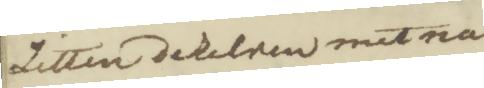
zitten dezelven met na
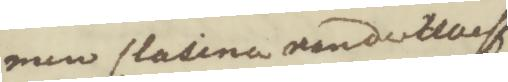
men Clasina vander Stoett
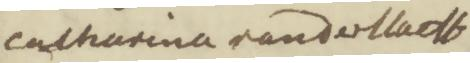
catharina vander Stoett
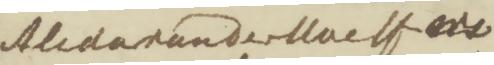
Alida vander Stoett wo
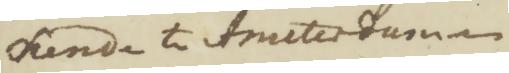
nende te Amsterdam en
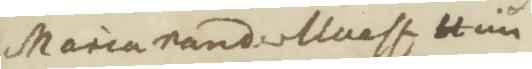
Maria vander Stoett Huis
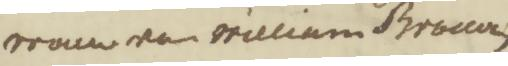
vrouw van william Brouwer
